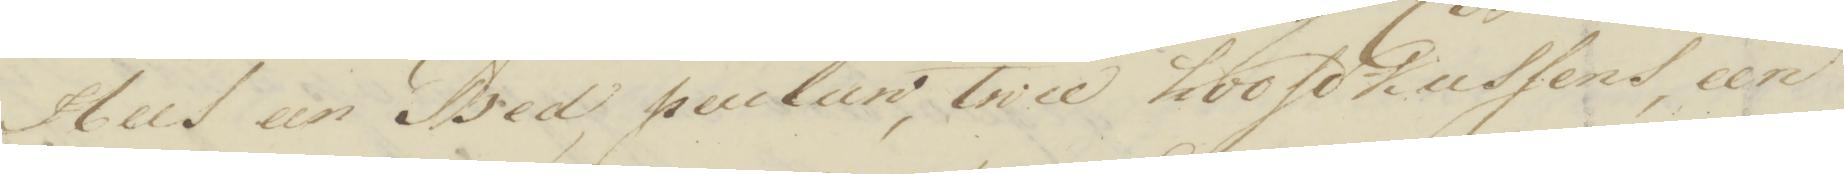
Hees een Bed, penluw, twee hoofdkussens, een
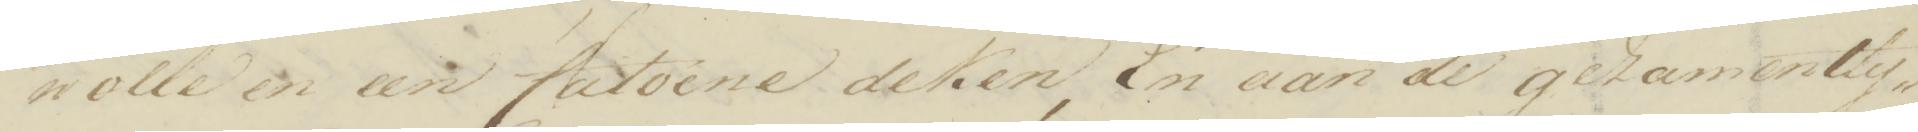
wolle en een Catoene deken, En aan de gezamently„
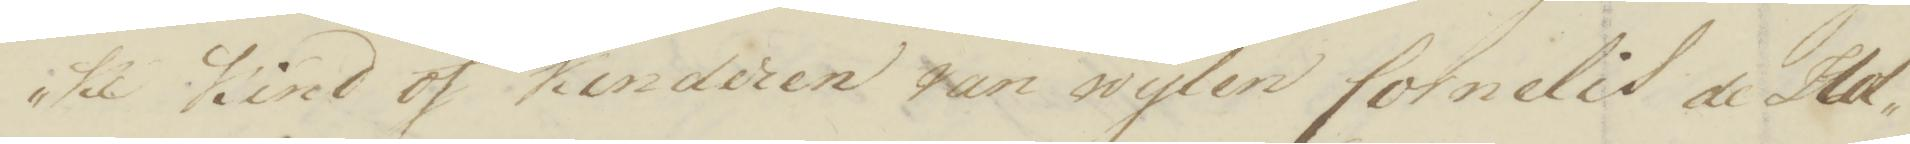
„ke kind of kinderen van wylen Cornelis de Hol„
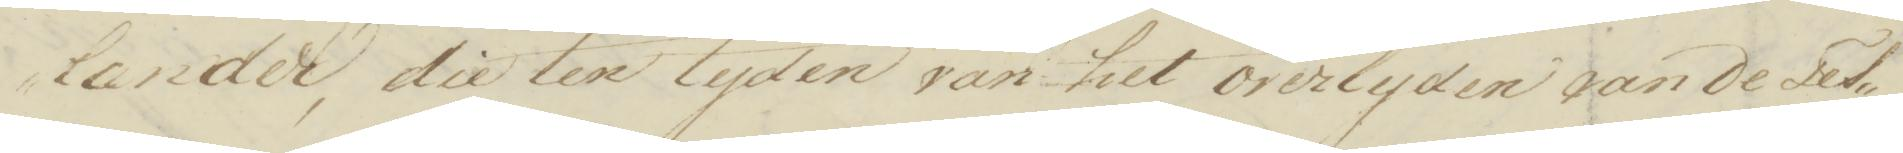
„lander, die ten tyden van het overlyden van de Tes„
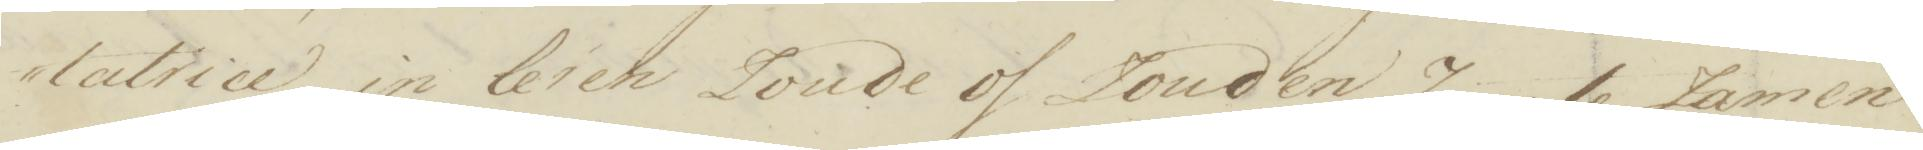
„tatrice in leven zoude of zouden zyn, te zamen
